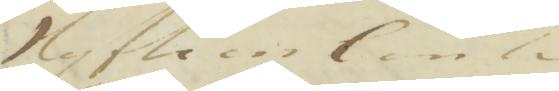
Vyftien Cents
